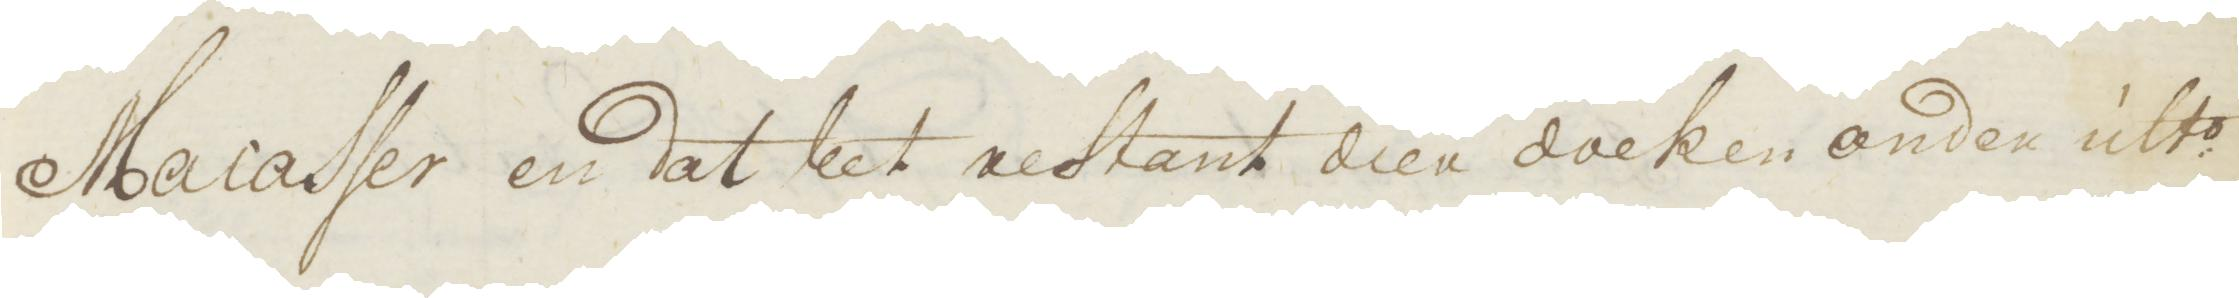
Macasser en dat het restant dier doeken onder ult:o
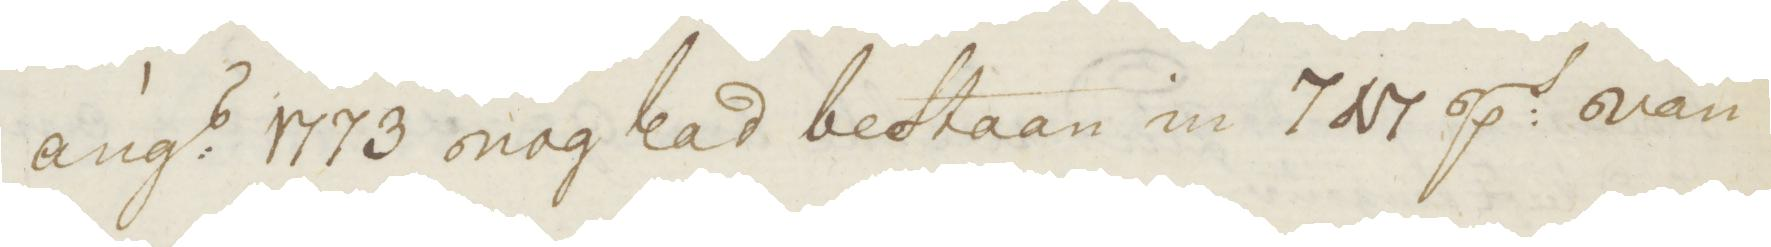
aug:s 1773 nog had bestaan in 747 p:s van
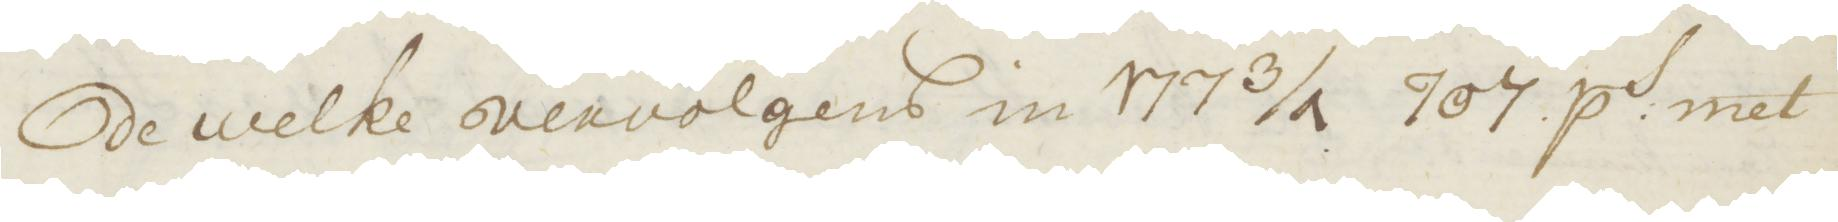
de welke vervolgens in 177¾ 707. p:s met
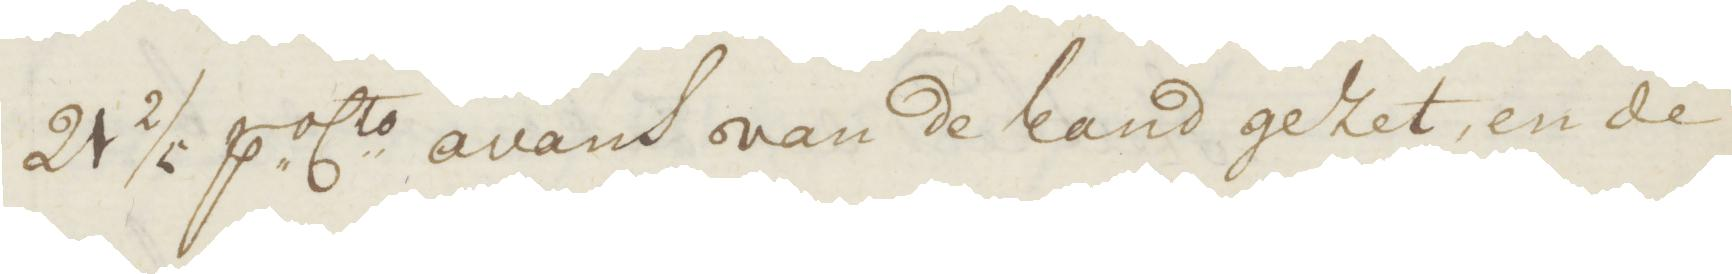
21 2/5 p„oCto„ avans van de hand gezet, en de
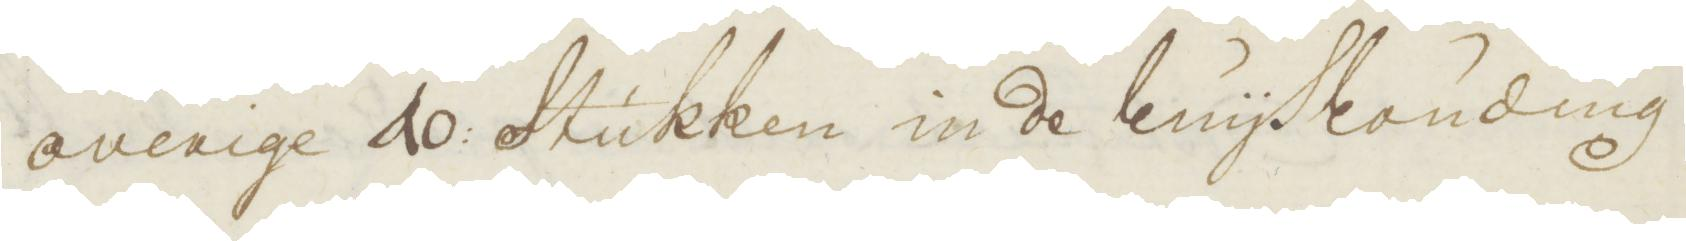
overige 40: stukken in de huijshouding
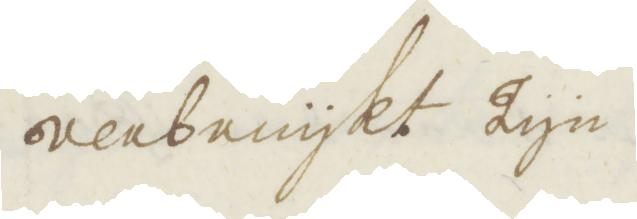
verbruijkt zijn
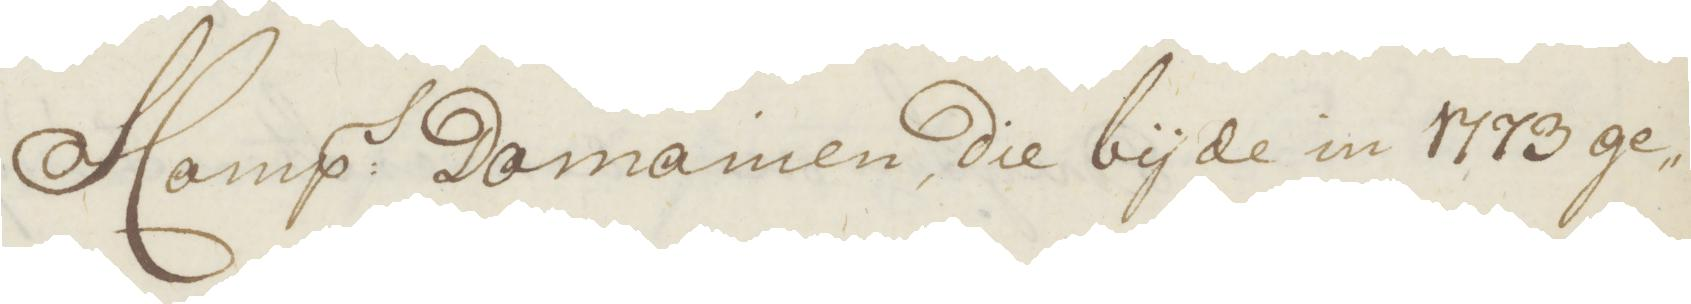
SComp:s Domainen, die bij de in 1773 ge„
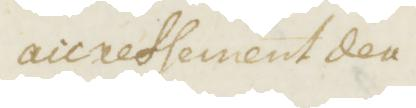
aicressement der
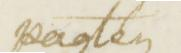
pagten
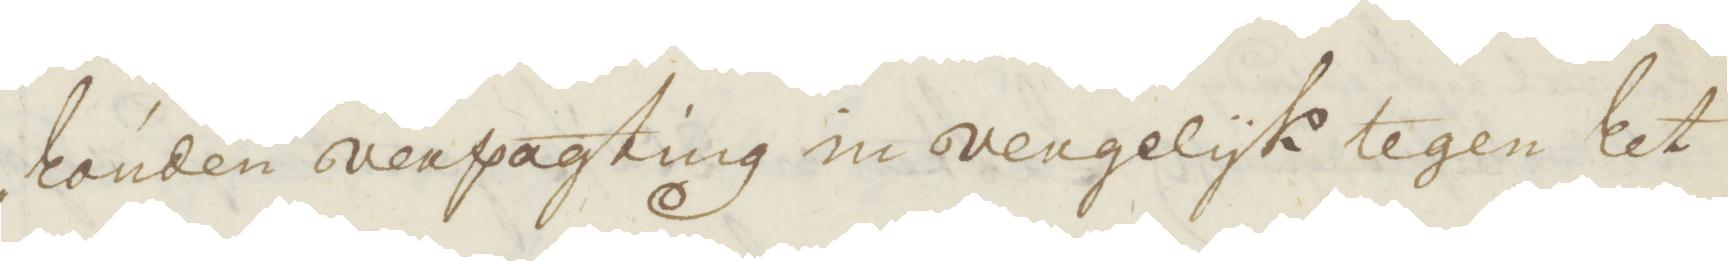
„houden verpagting in vergelijk tegen het
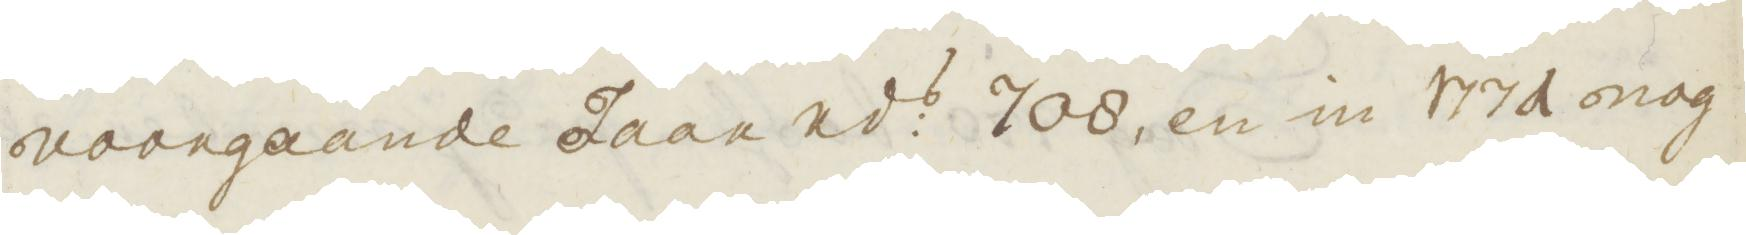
voorgaande Jaar rd:s 708, en in 1774 nog
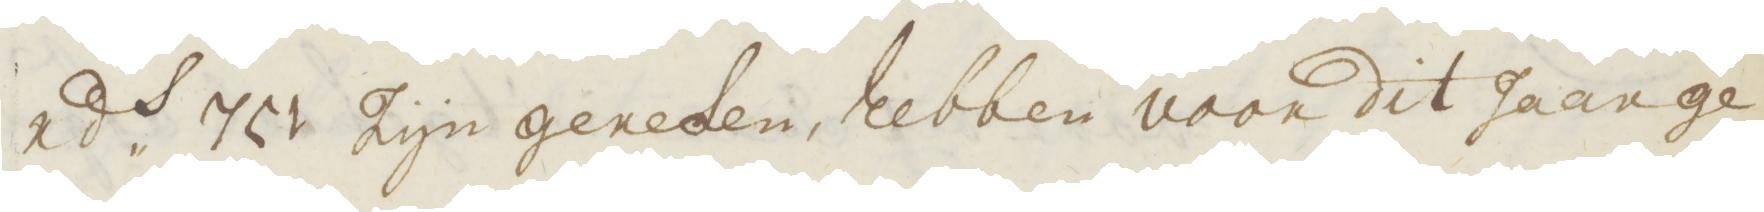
rd„s 751 zijn geresen, hebben voor dit jaar ge
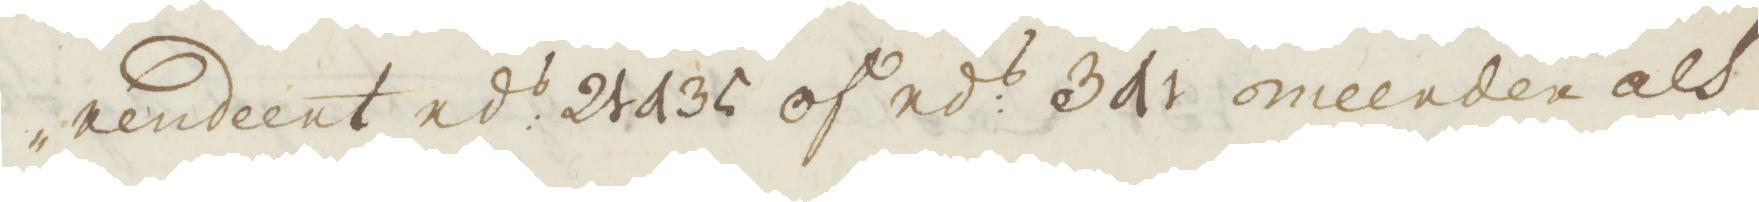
„rendeert rd:s 21435 of rd:s 341 meerder als
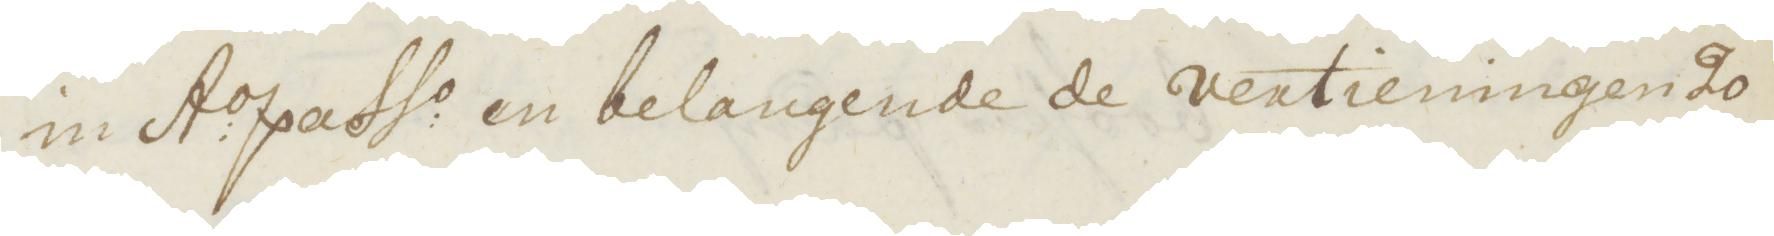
in A:o pass:o en belangende de vertieningen Zo
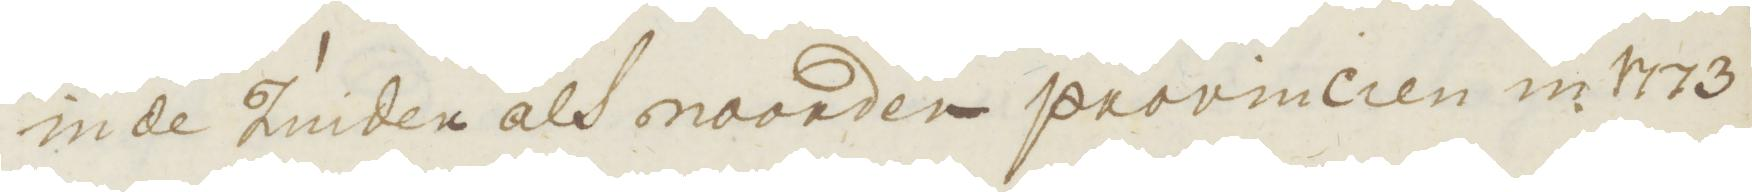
in de zuider als noorder provincien in 1773
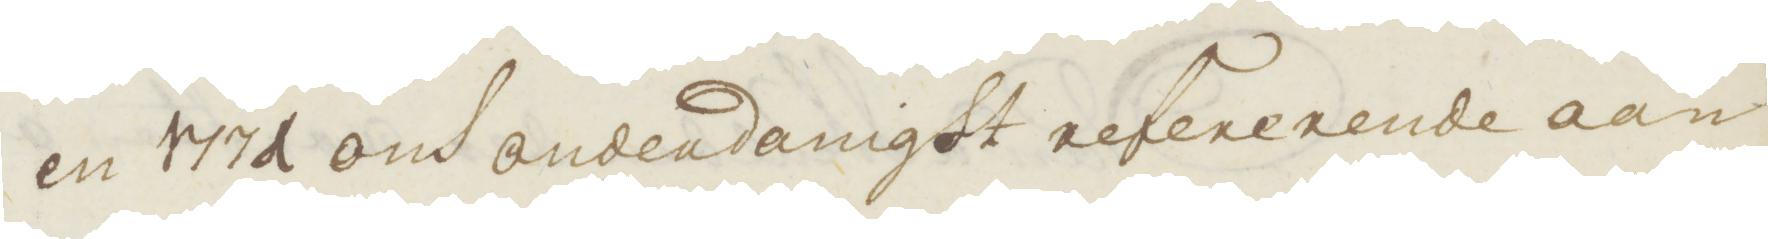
en 1774 ons onderdanigst refererende aan
